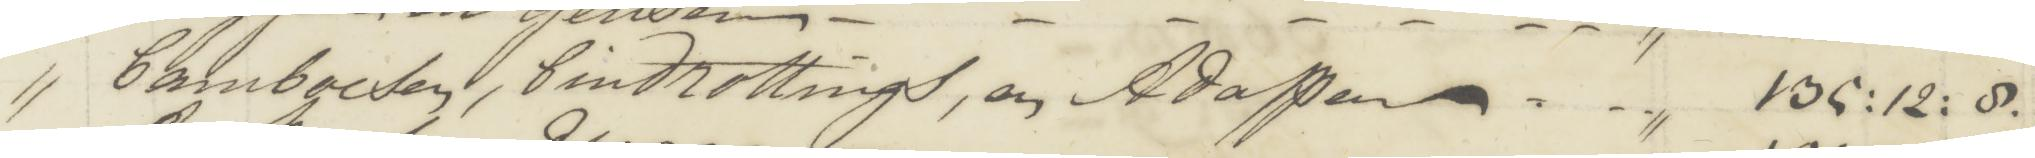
„ bamboesen, bindrottings, en Adappen – – -„ 135: 12: 8.
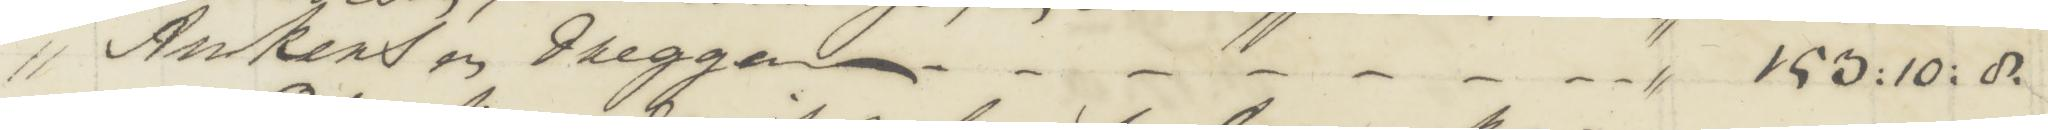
„ Ankers en dreggen – – – – – – – – „ 153: 10: 8.
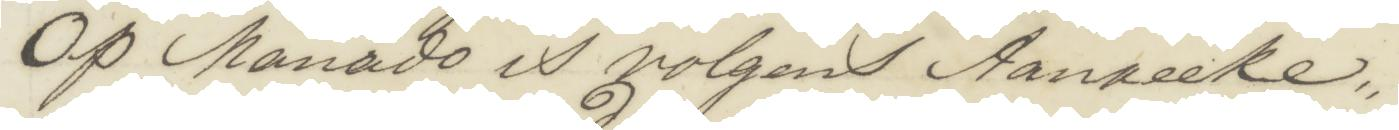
Op Manado is volgens Aanreeke„
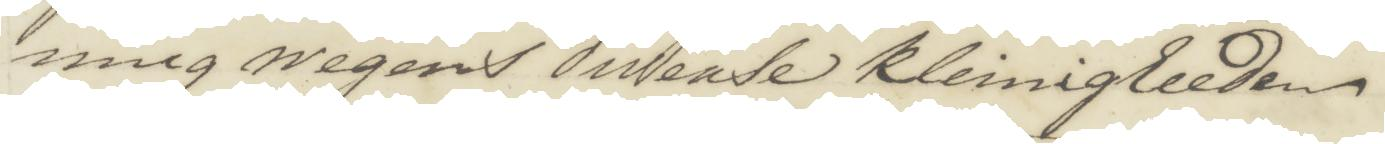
ning wegens diverse kleinigheeden
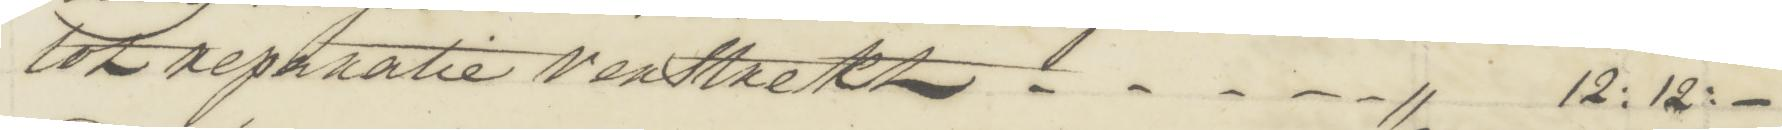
tot reparatie verstrekt – – – – – „ 12: 12: —
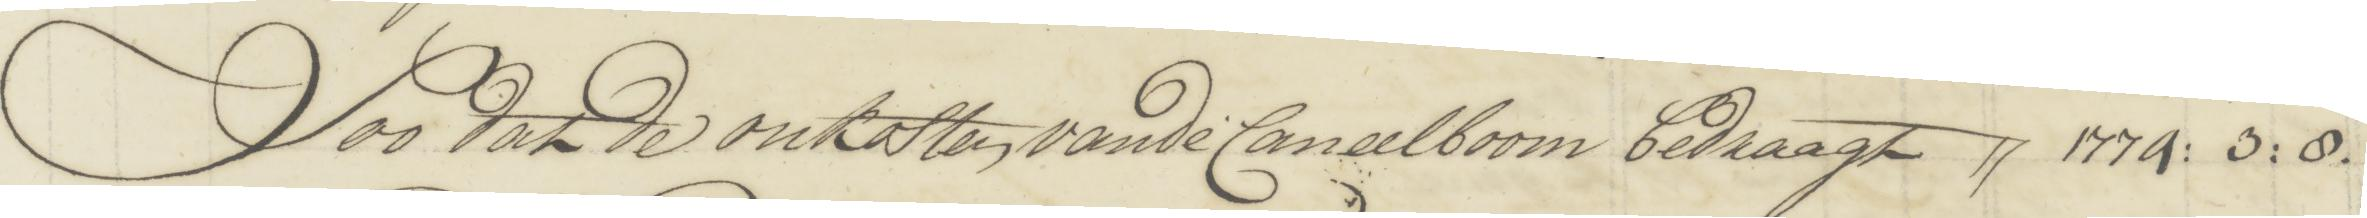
Soo dat de onkosten vande Caneelboom bedraagt „ 1774: 3: 8.
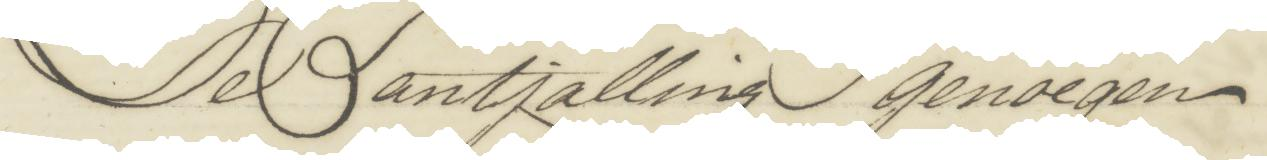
De Pantjalling 'T genoegen
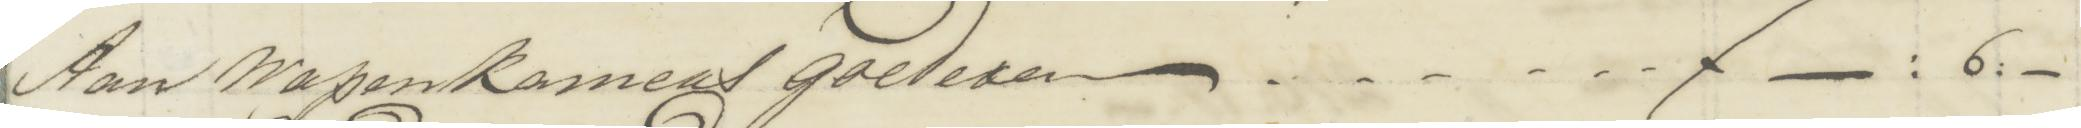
Aan Wapenkamers goederen - - – - - - ƒ — : 6: —
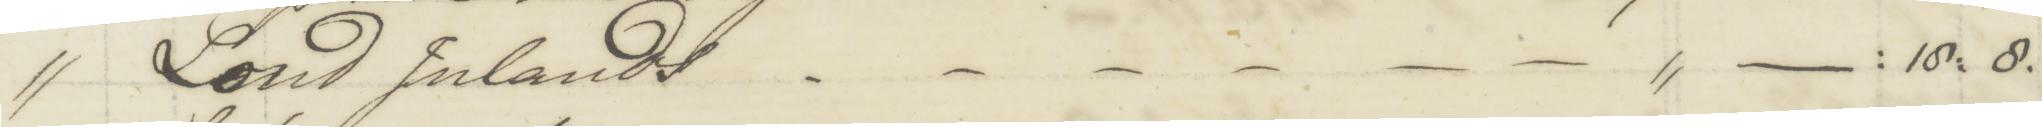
„ Lond Jnlands - – – – — — „ —: 18: 8.
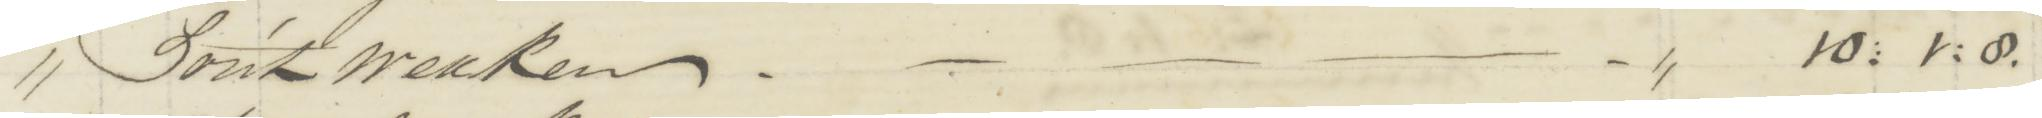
„ Hout werken - — — — – „ 10: 1: 8.
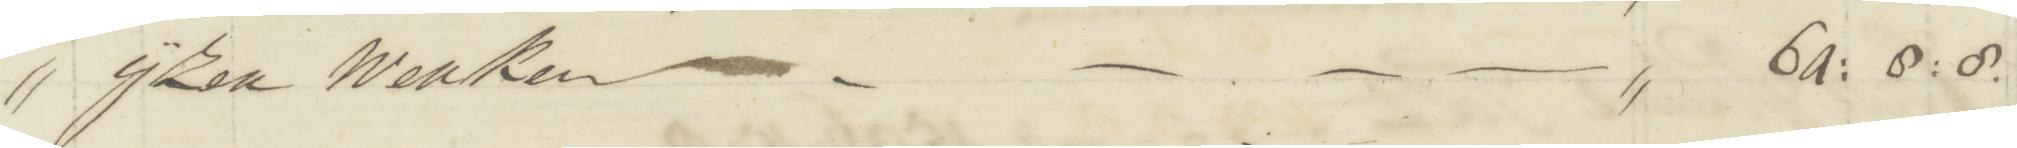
„ ijzer werken – — — — „ 64: 8: 8.
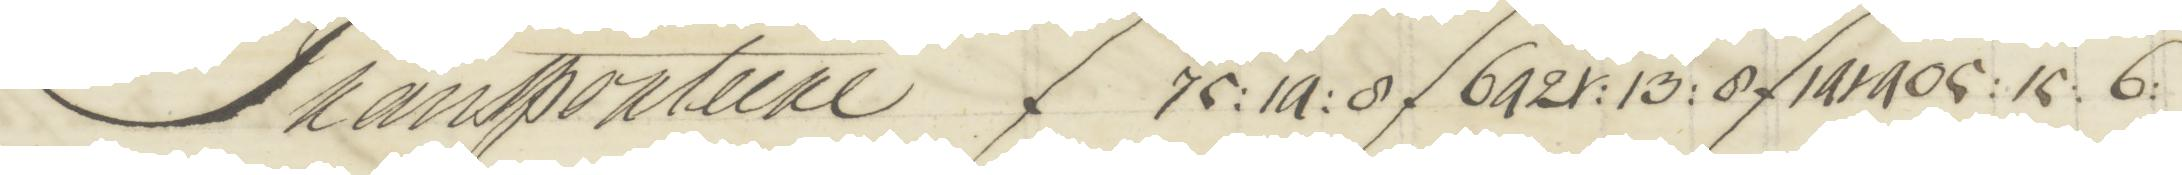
Transporteere ƒ 75:14:8 ƒ 6421:13: 8 ƒ141405:15: 6:
